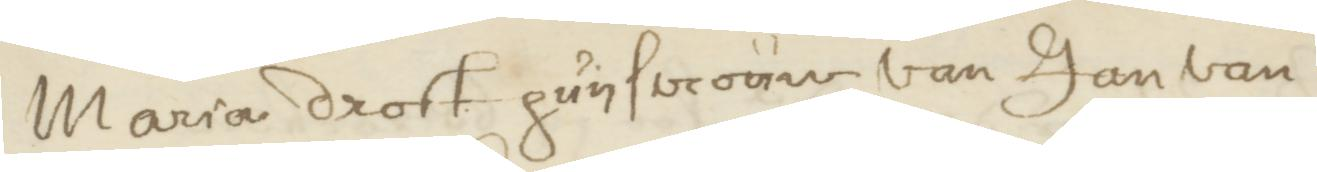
Maria drost huijsvrouw van Jan van
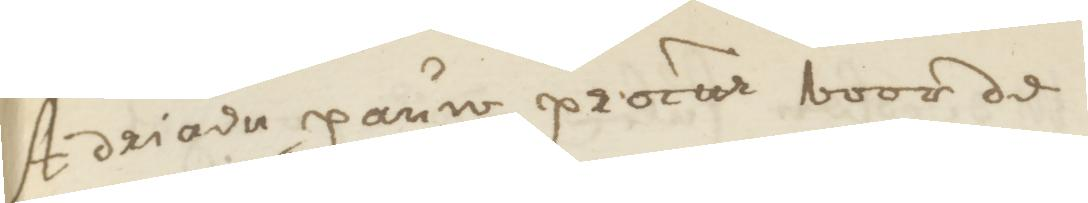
Adriaen pauw procur voor de
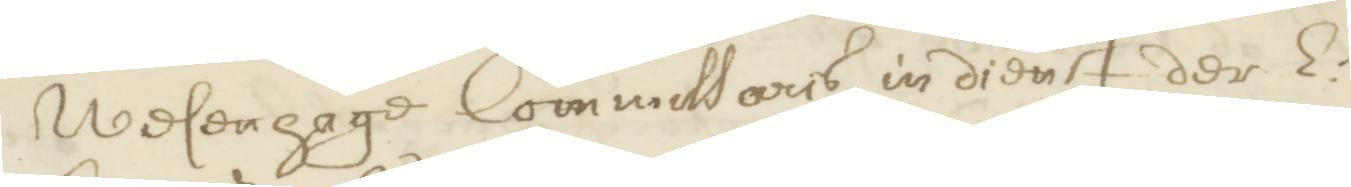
Wesenhage Commissaris in dienst der E:
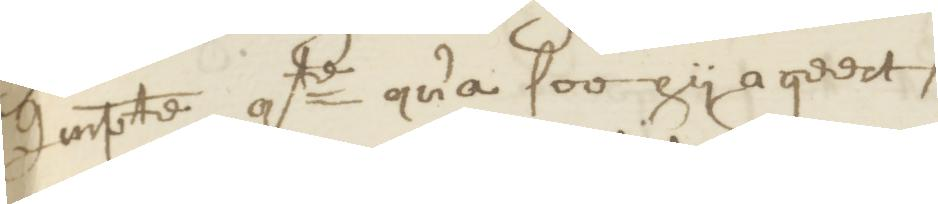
Jmpte q=te qua soo hij ageert
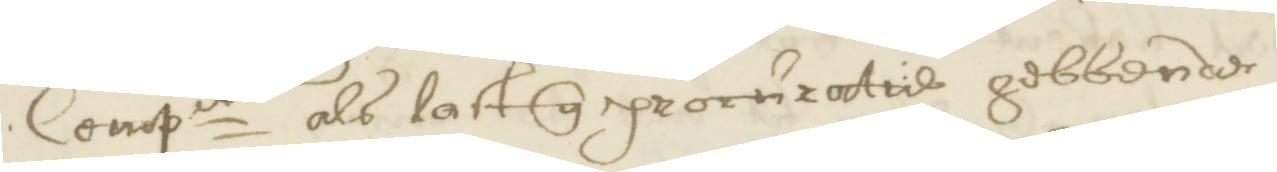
Comp=e als lastg procuratie hebbende
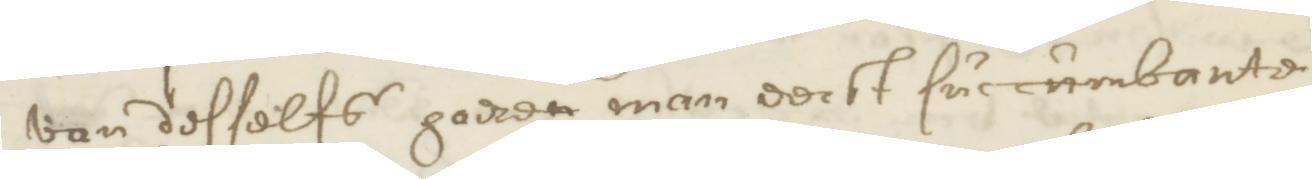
van desselfs haeren man eerst succumbante
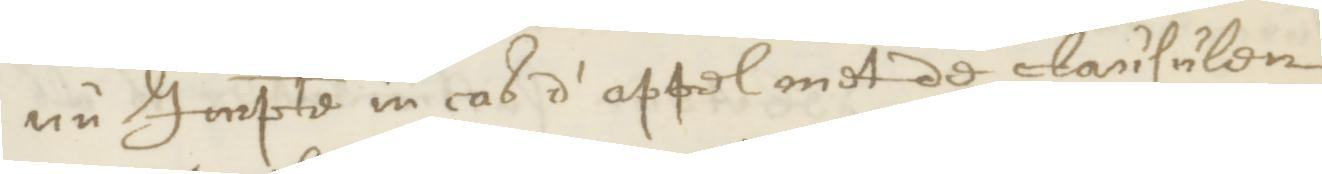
nu Jmpte in cas d’ appel met de clausulen
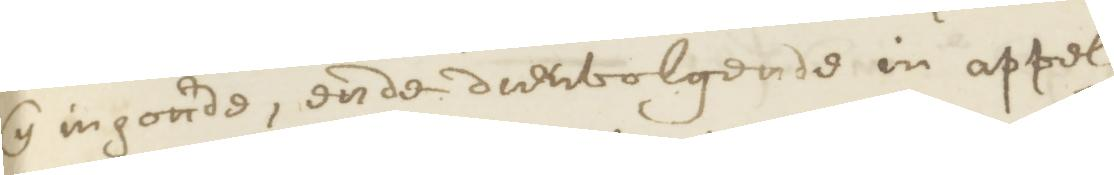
ende inhoude, ende dienvolgende in appel
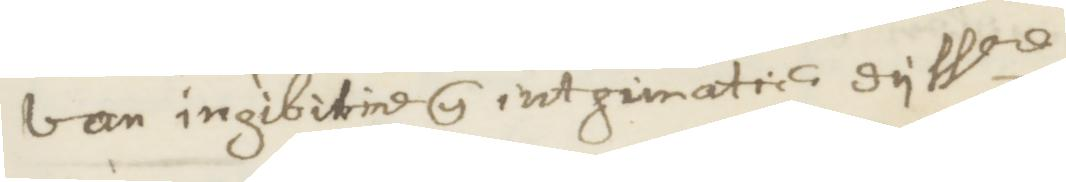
van inhibitie ende inthimatie eijss=ce
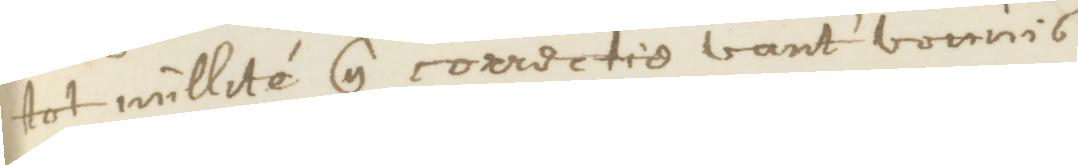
tot millité ende correctie vant' vonnis
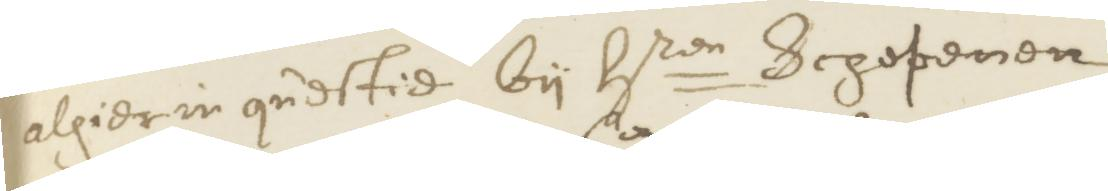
alhier in questie bij h=ren Schepenen
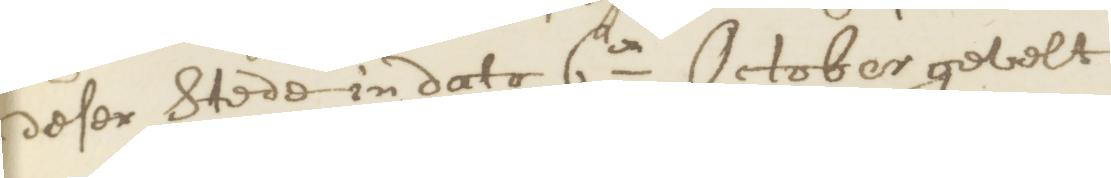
deser stede in dato 6=en October gevelt
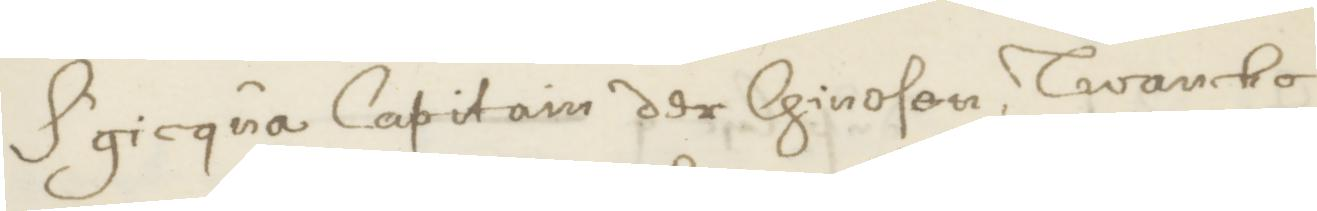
S'gicqua Capitain der Chinesen, Twancko
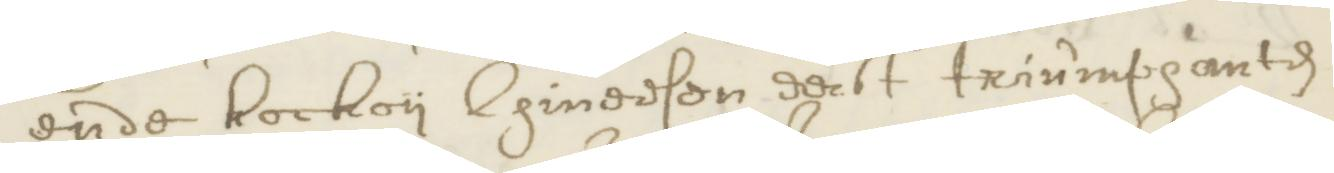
ende kockoij Chineesen eerst triumphanten
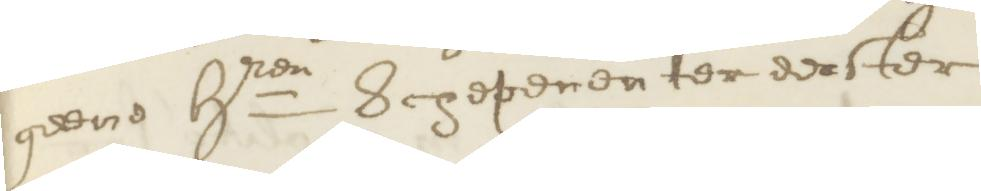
geene h=ren schepenen ter eerster
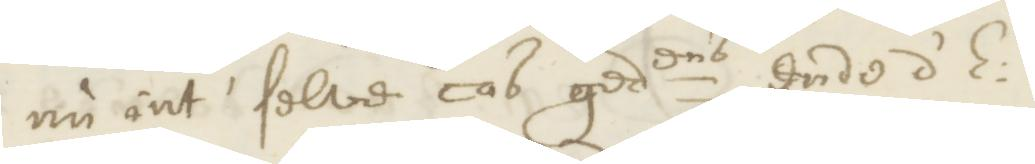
ende nu int' selve cas ged=ens ende d’ E: H=ren
